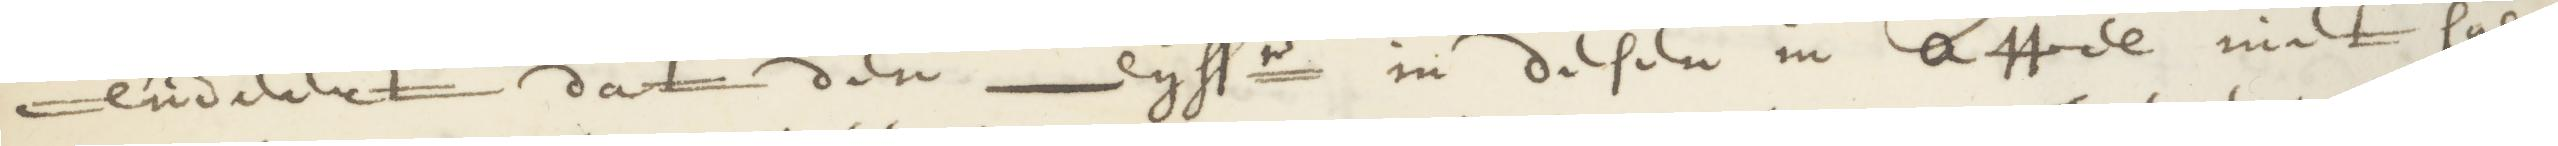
cludeert dat den eijss=r in desen in appel niet sal
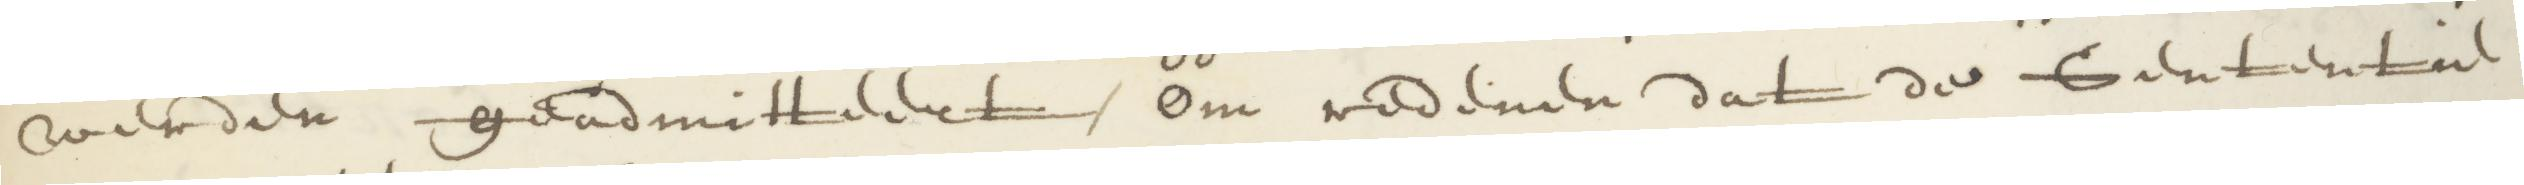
werden geadmitteert, om redenen dat de Sententie
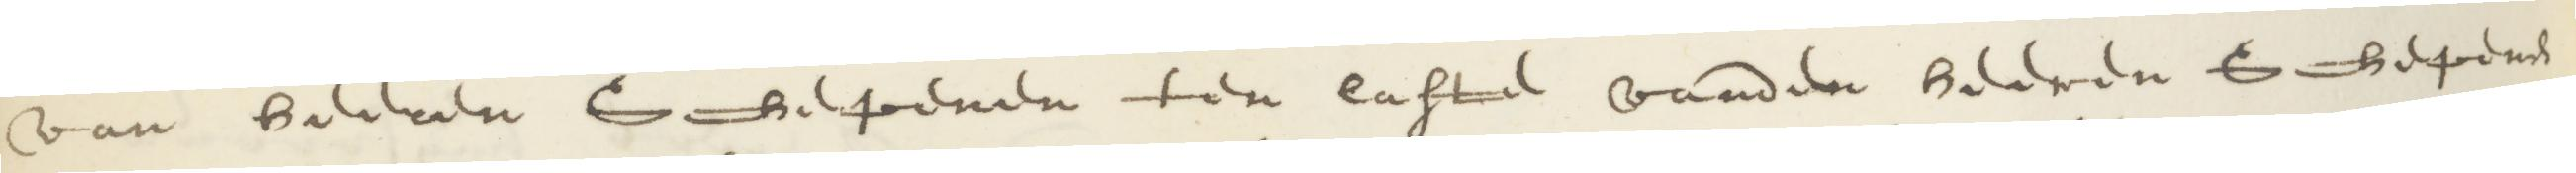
van heeren Schepenen ten laste van der heeren Schepens
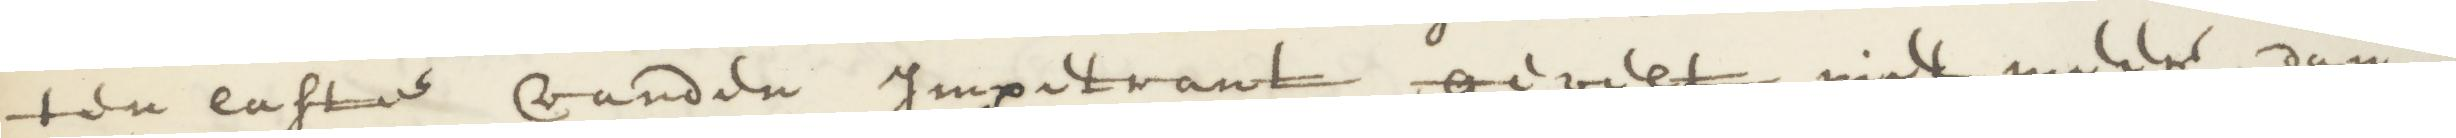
ten laste vanden Jmpetrant gevelt niet meer dan
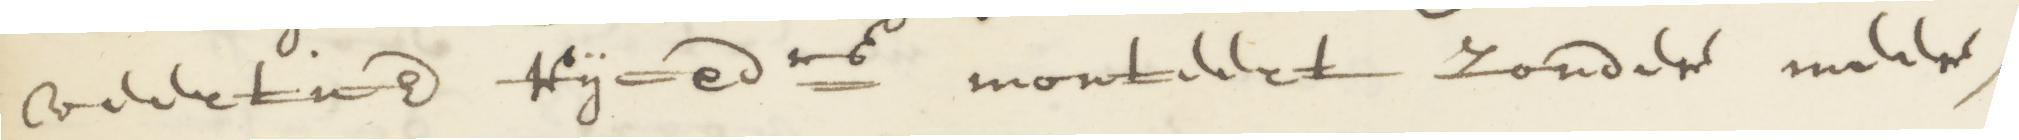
veertich Rijcxd=s monteert zonder meer
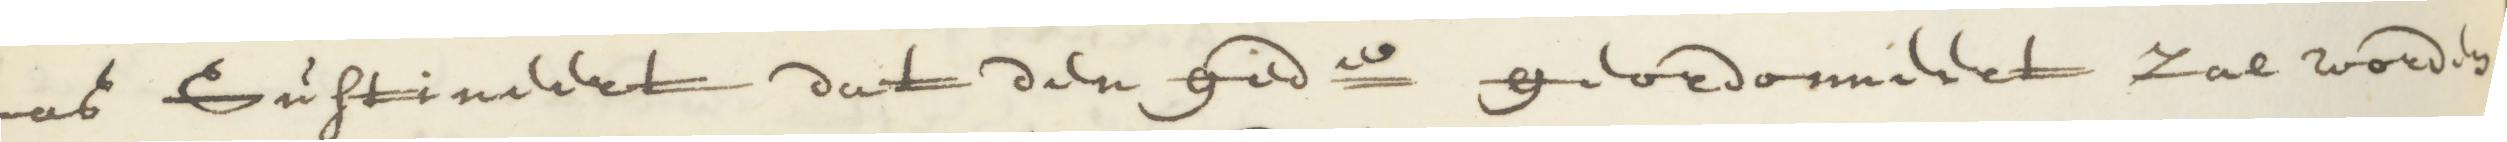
as Sustineert dat den ged=e geordonneert zal worden
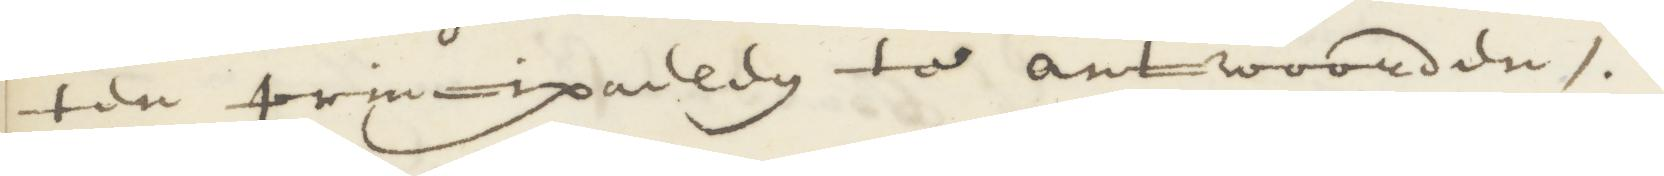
ten principaelen te antwoorden/.
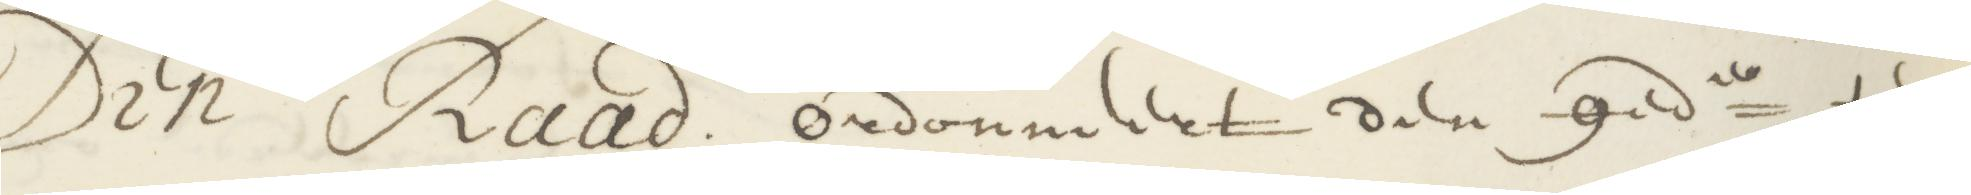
Den Raad. ordonneert den ged=e ten
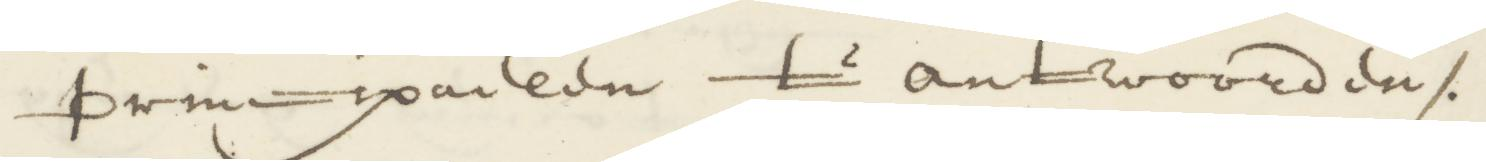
principaelen t' antwoorden/.
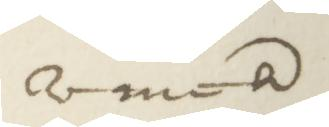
vinck
